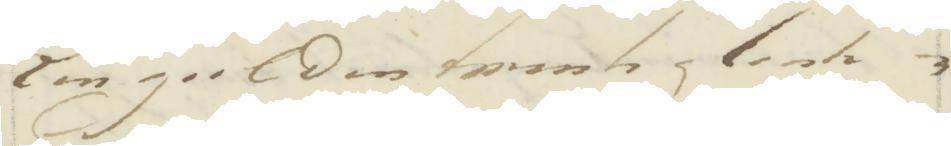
Een gulden twintig Cent
